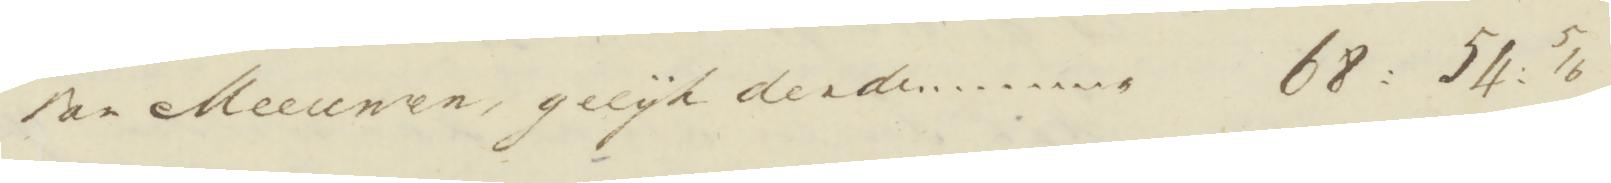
van Meeuwen, gelijk derde . . . . . . . . . „ 68: 54: 5/6
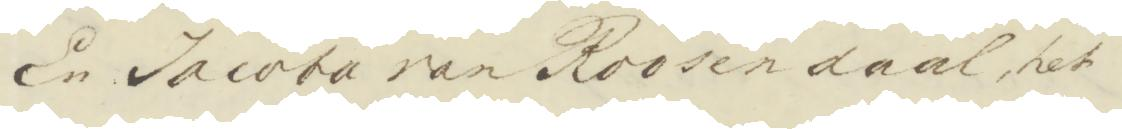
En Jacoba van Roosendaal, het
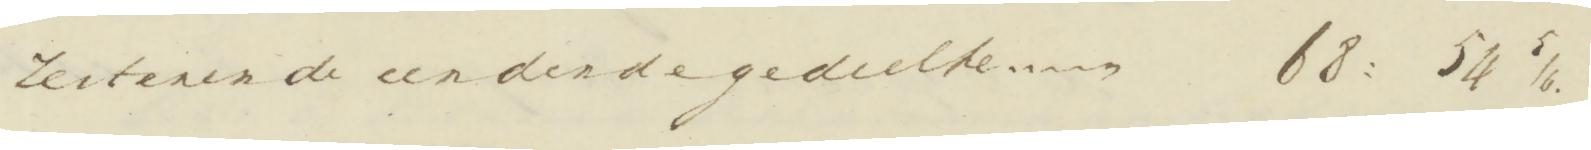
resterende een derde gedeelte —„ 68: 54 5/6.
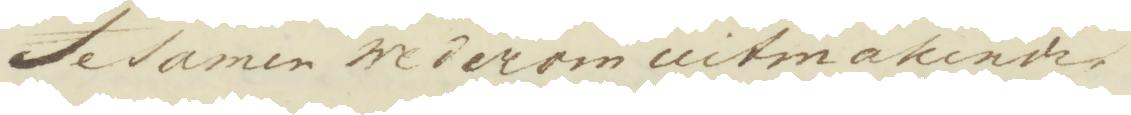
Tesamen wederom uitmakende,
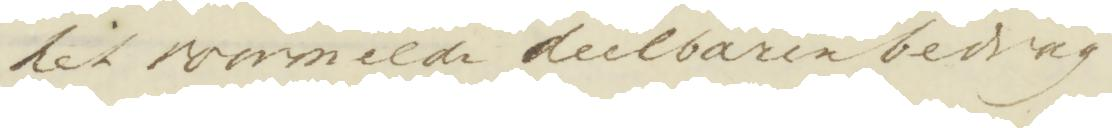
het voormelde deelbaren bedrag
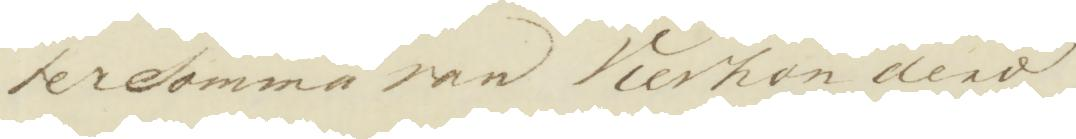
ter somma van Vierhon derd
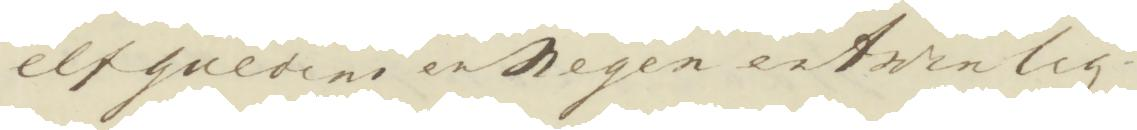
elf gulden en Negen entwintig
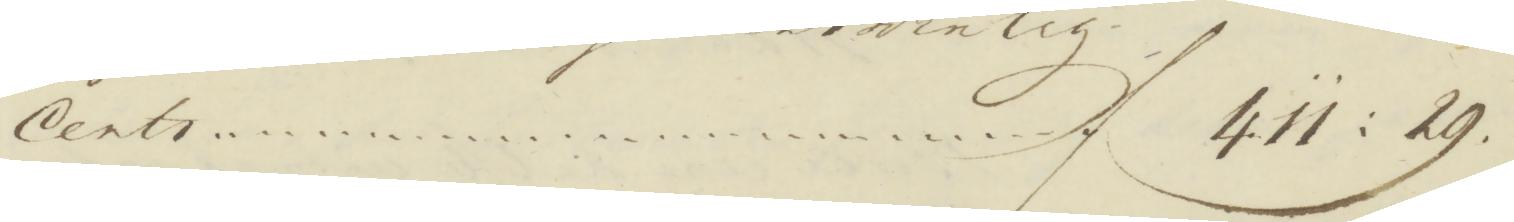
Cents . . . . . . . . . . . . . . . . . . . . . . . . . .ƒ 411 : 29.
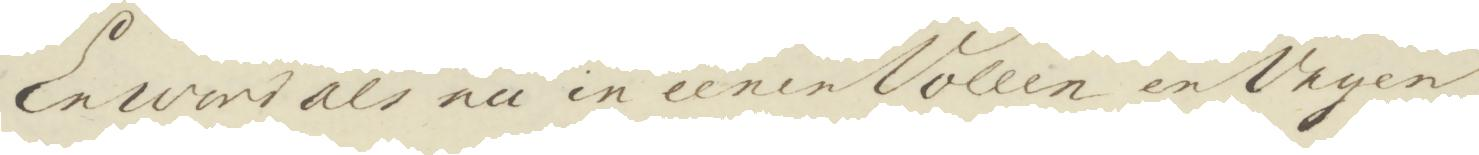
En word als nu in eenen Vollen en Vryen
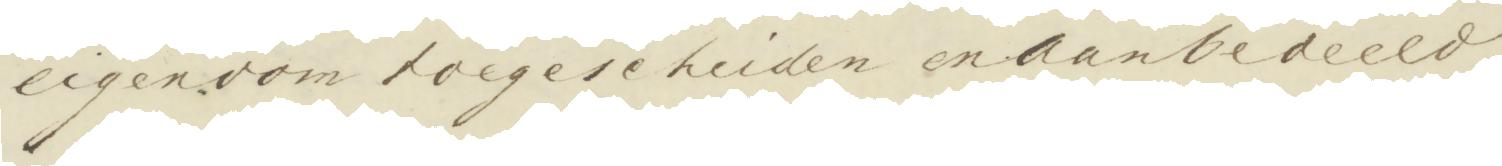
eigendom toegescheiden en dan bedeeld
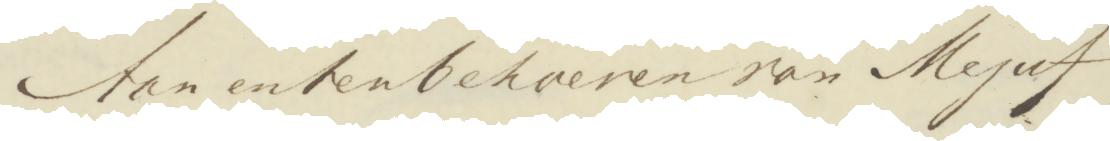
Aan entenbehoeven van Mejuf
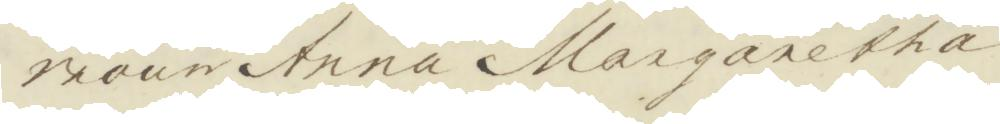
vrouw Anna Margaretha
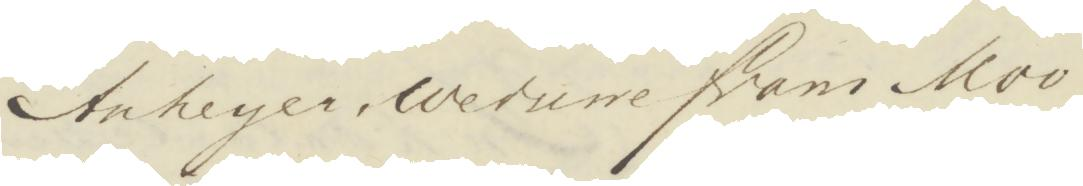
Anheyer, weduwe Frans Moo
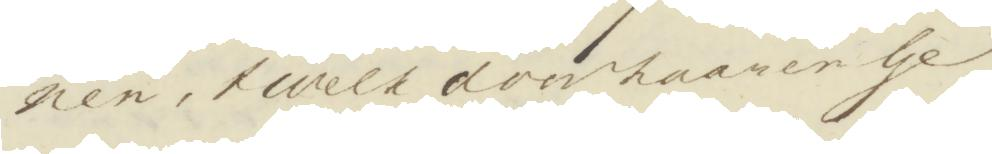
nen, t welk door haaren ge
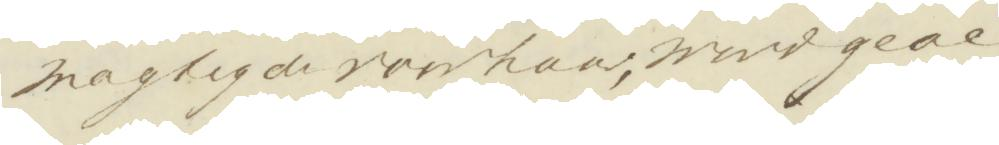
magtigde voor haar, word geac
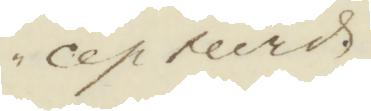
„cepteerd.
